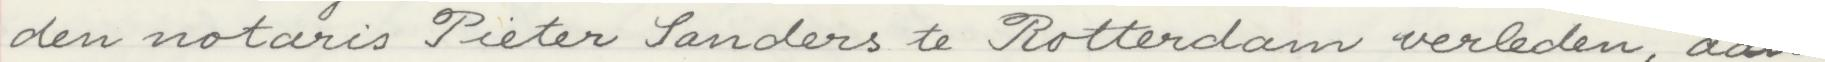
den notaris Pieter Sanders te Rotterdam verleden, aan
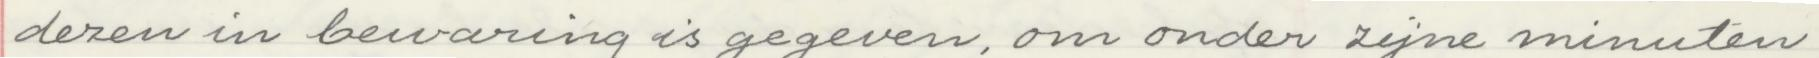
dezen in bewaring is gegeven, om onder zijne minuten
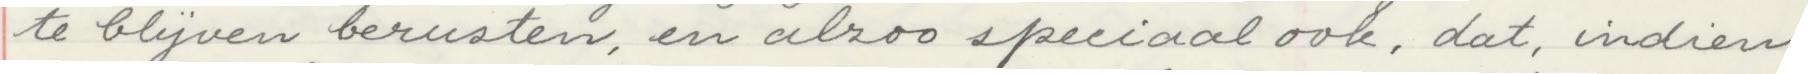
te blijven berusten, en alzoo speciaal ook, dat, indien
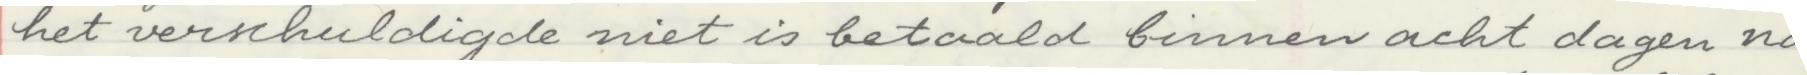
het verschuldigde niet is betaald binnen acht dagen na
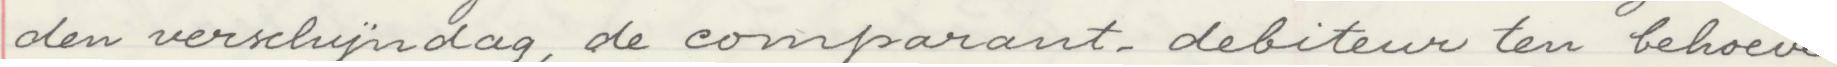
den verschijndag, de comparant- debiteur ten behoeve
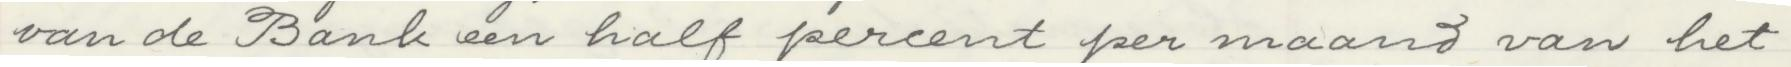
van de Bank een half percent per maand van het
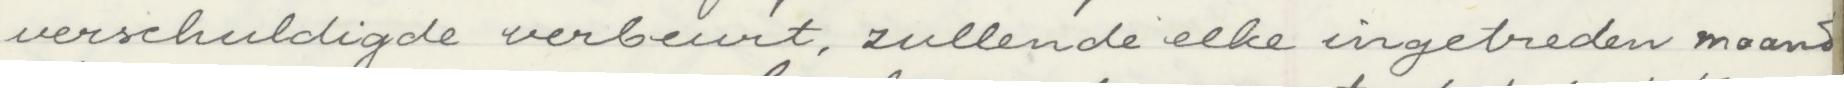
verschuldigde verbeurt, zullende elke ingebieden maand
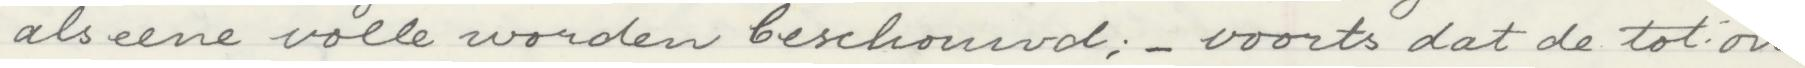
als eene volle worden beschouwd; – voorts dat de tot on
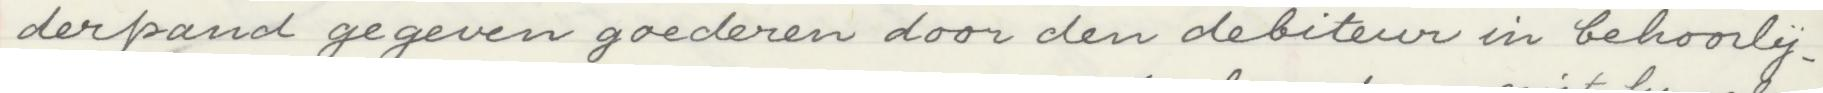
derpand gegeven goederen door den debiteur in behoorlij-
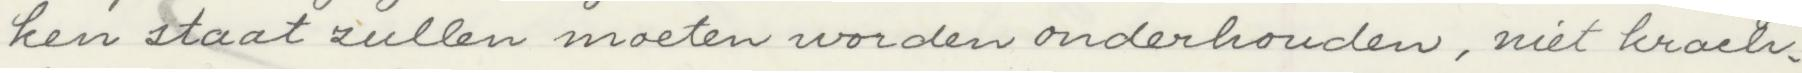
ken staat zullen moeten worden onderhouden, niet krach
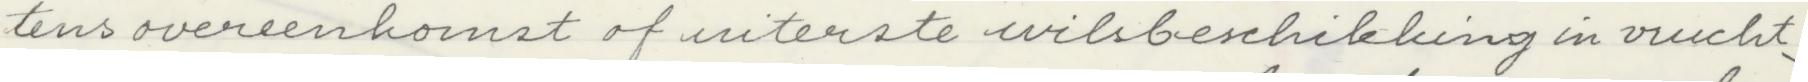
tens overeenkomst of uiterste wilsbeschikking in vrucht-
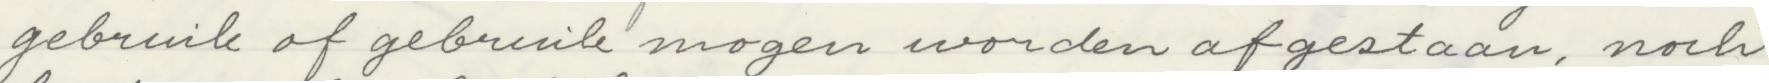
gebruik of gebruik mogen worden afgestaan, noch
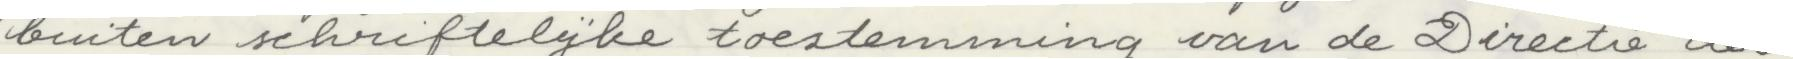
buiten schriftelijke toestemming van de Directie der
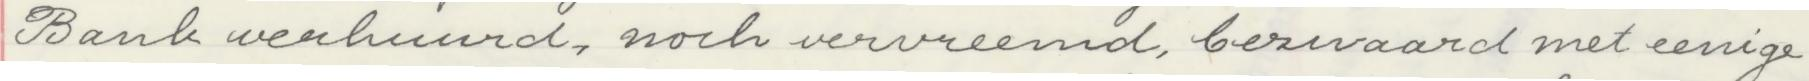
Bank verhuurd, noch vervreemd, bezwaard met eenige
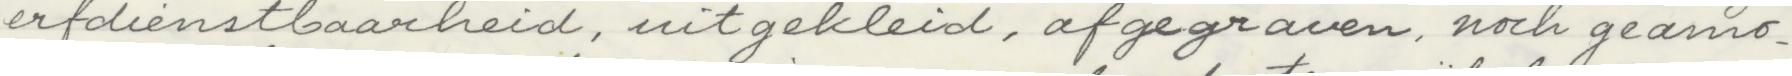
erfdienstbaarheid, uitgekleid, afgegraven, noch geamo-
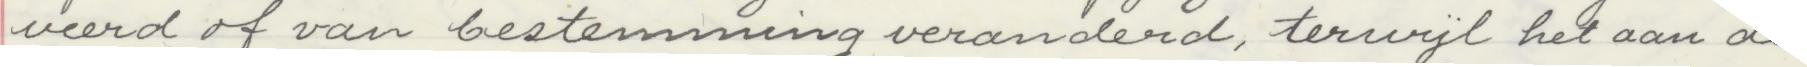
veerd of van bestemming veranderd, terwijl het aan de
